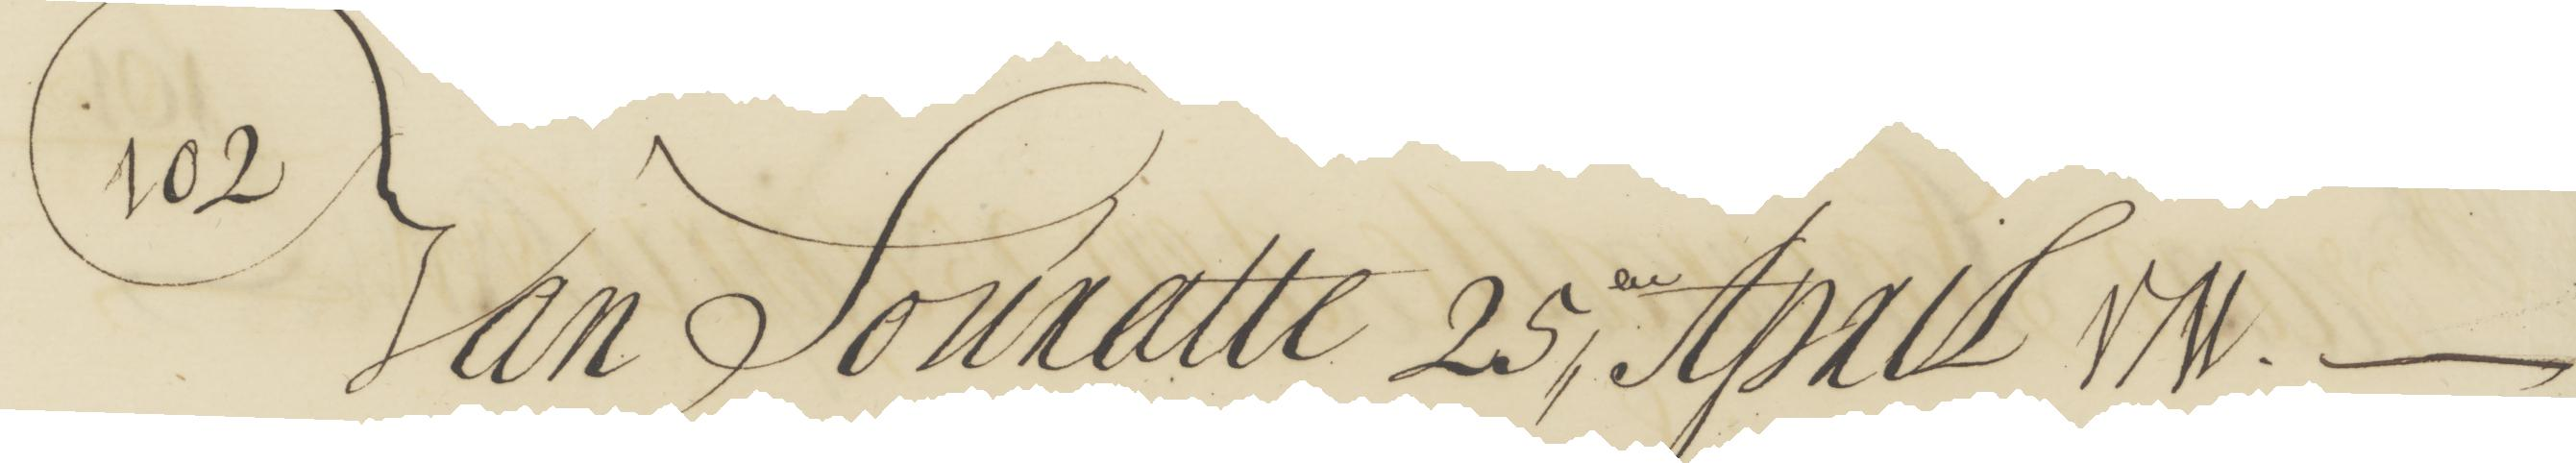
Van Souratte 25„en April 1711. —
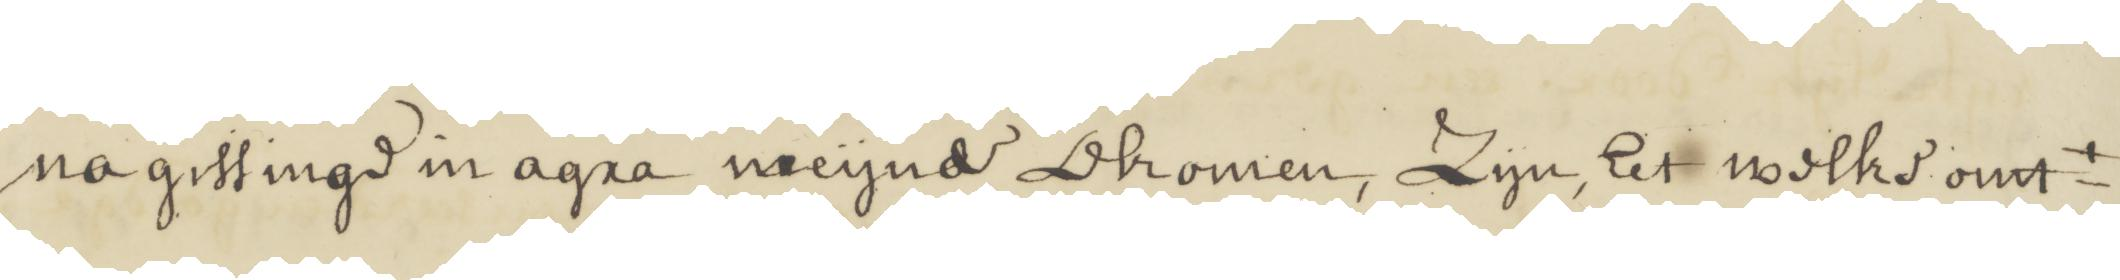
na gissinge in agra meijnde tekomen, zijn, het welke omt-t
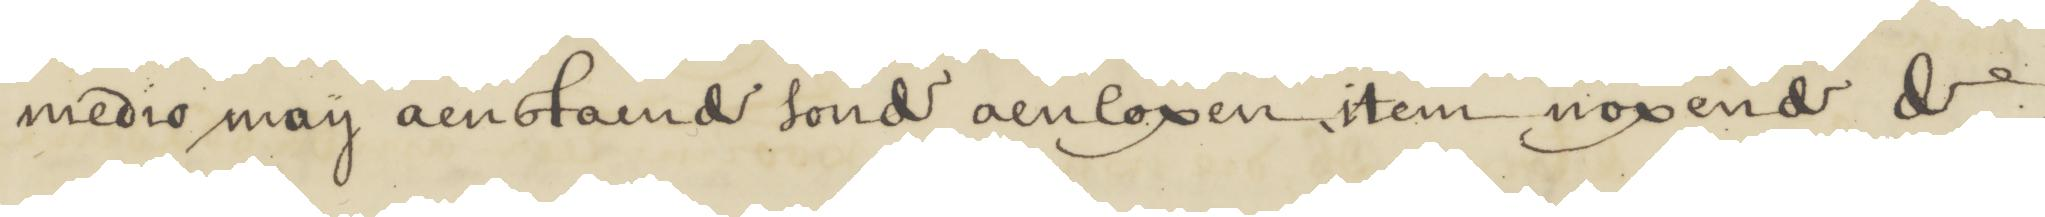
medio maij aenstaende soude aenlopen item nopende do
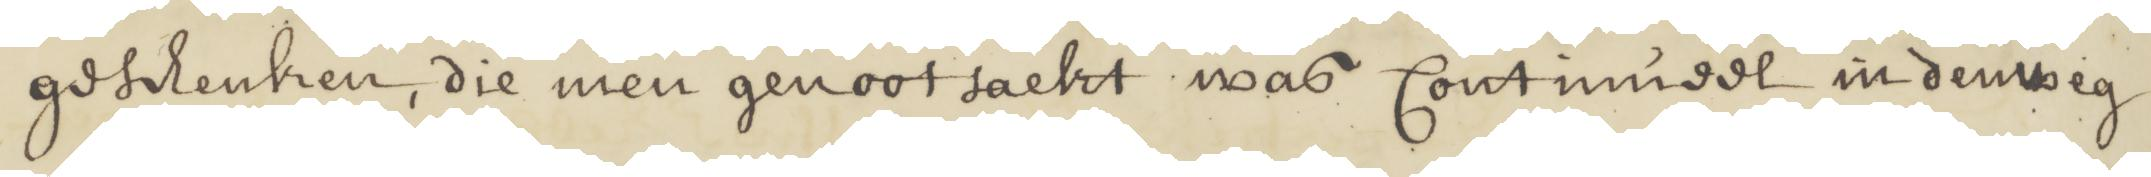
geschenken, die men genootsaekt was Continueel in denweg
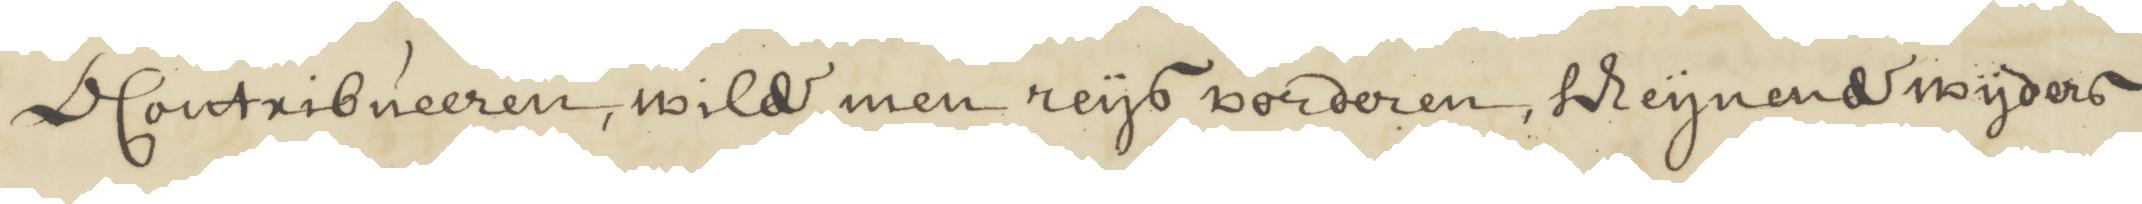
te Contribueeren, wilde men reijs vorderen, scheijnende wijders
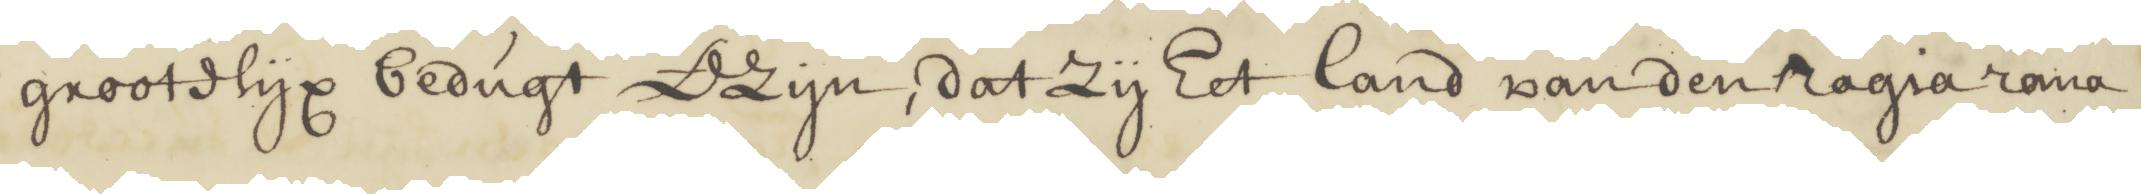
grootelijx bedugt tezijn, dat zij het land van den Ragia rana
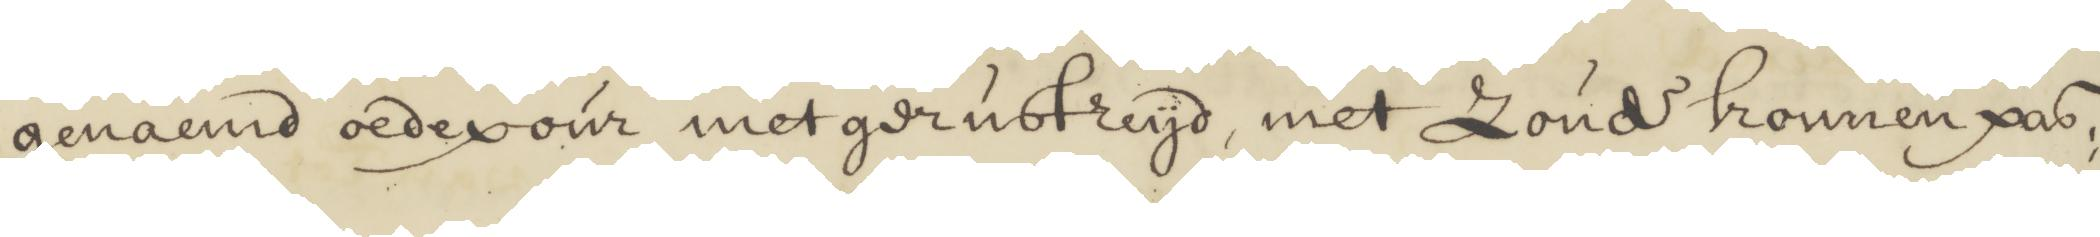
genaemd oedepour met gerustheijd, niet zoude konnen pas„
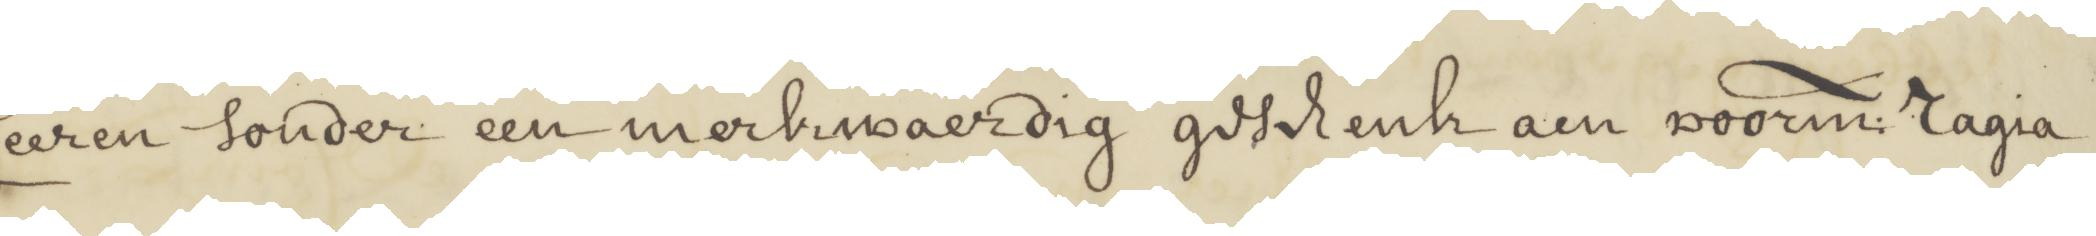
seeren sonder een merkwaerdig geschenk aen voorm: Ragia
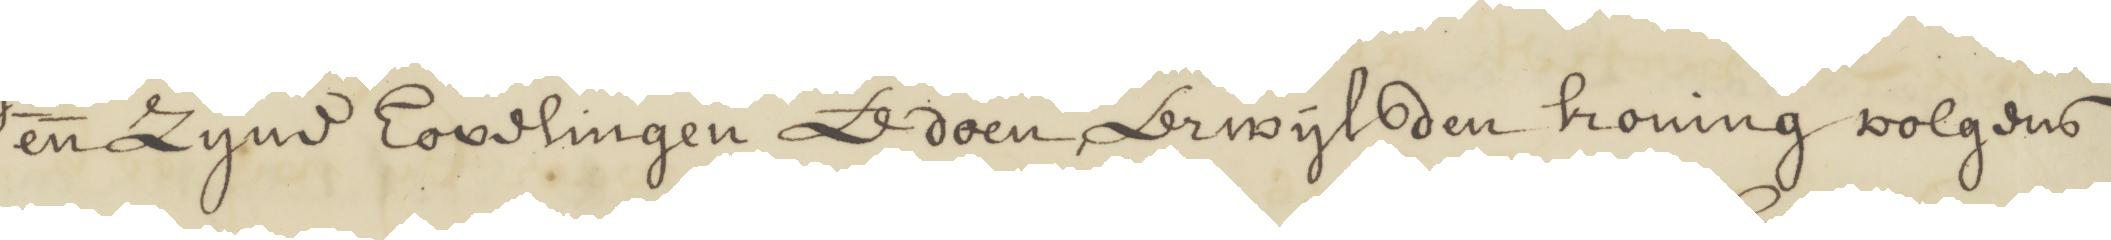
en zijne hovelingen te doen, terwijl den koning volgens
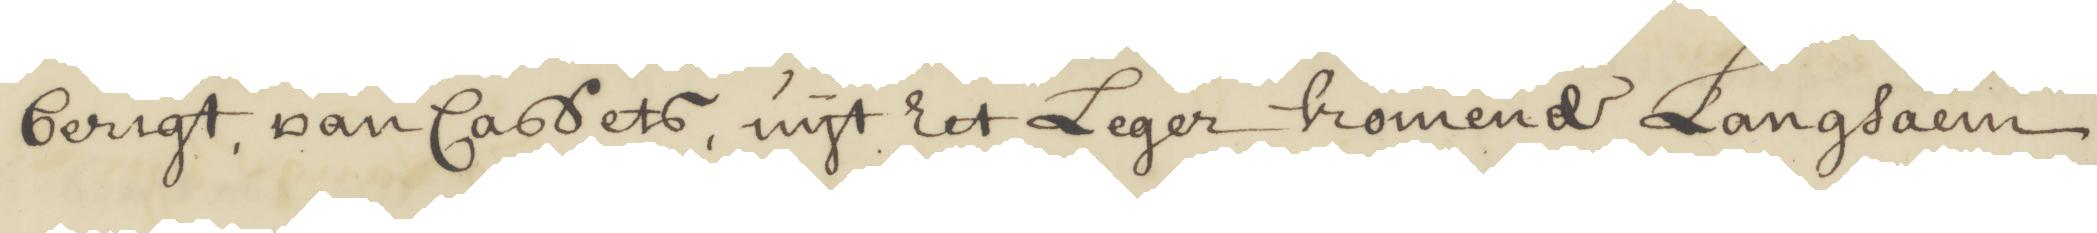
berigt, van Cassets, uijt het Leger komende Langsaem
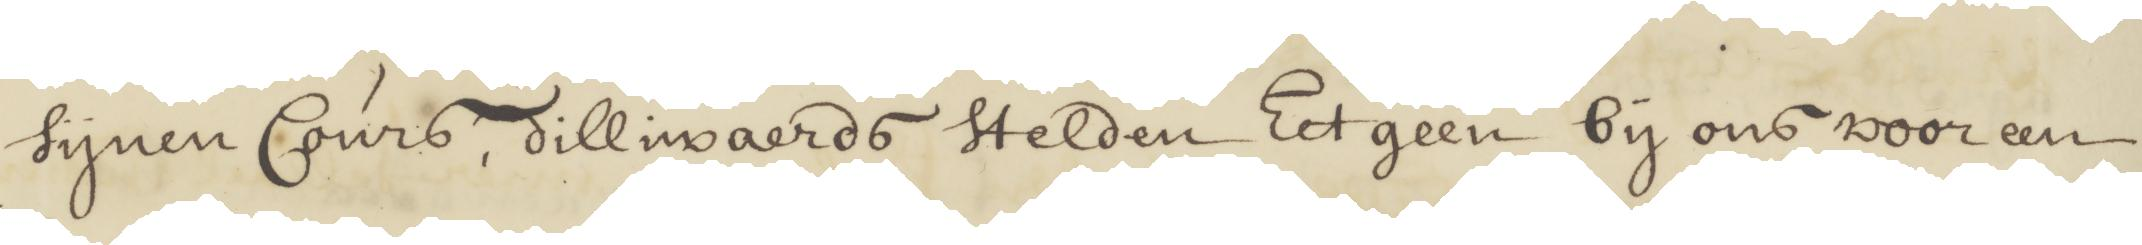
sijnen Cours, dilliwaerds stelden het geen bij ons voor een
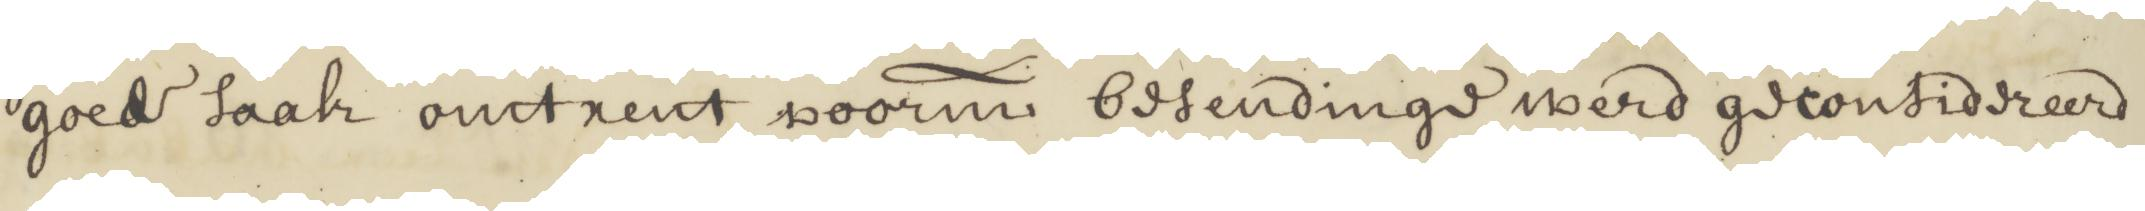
goede saak omtrent voorm: besendinge werd geconsidereerd
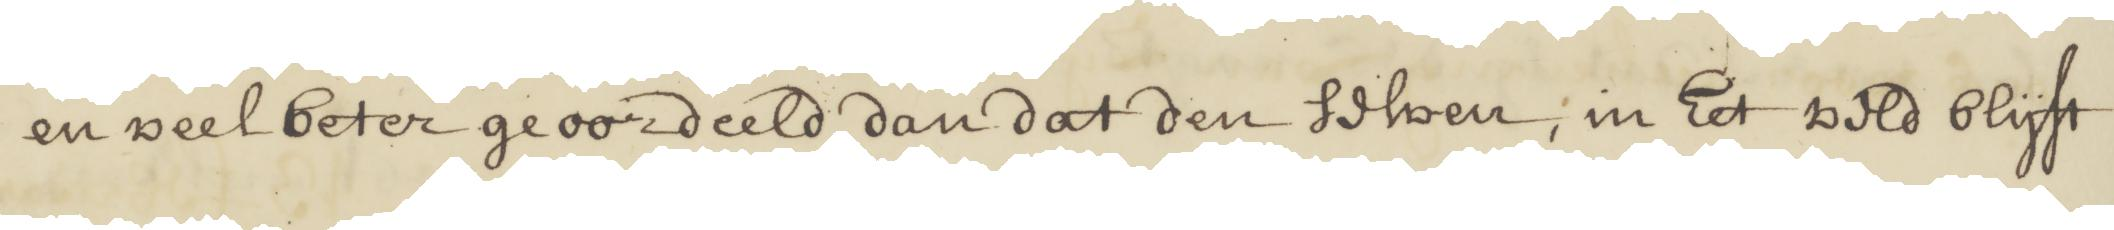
en veel beter geoordeeld, dan dat den selven, in het veld blijft
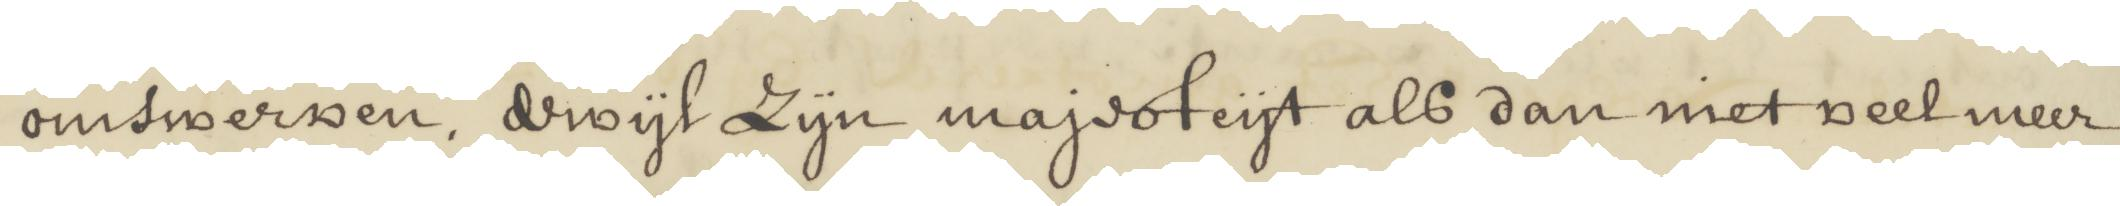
omswerven, dewijl zijn majesteijt als dan niet veel meer
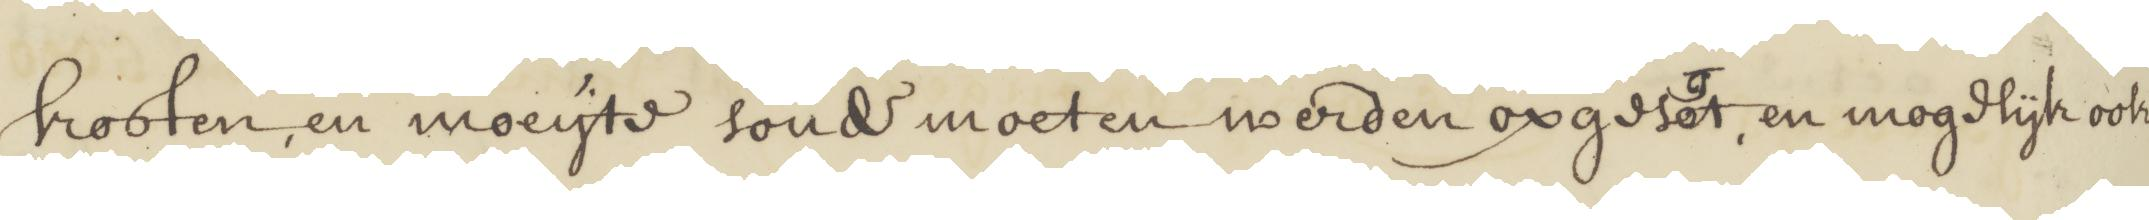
kosten, en moeijte soude moeten werden opgesegt, en mogelijk ook w
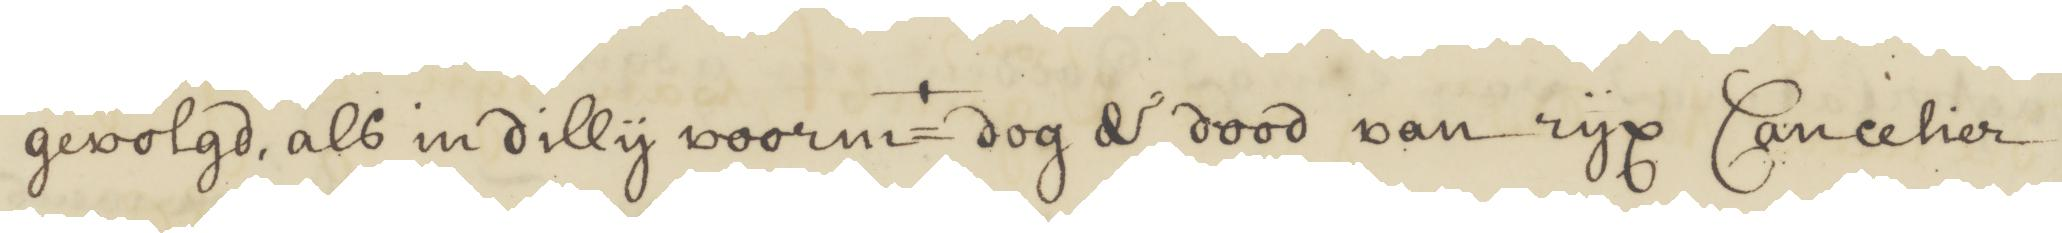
gevolgd, als in dillij voorm=t dog de dood van rijx Cancelier
